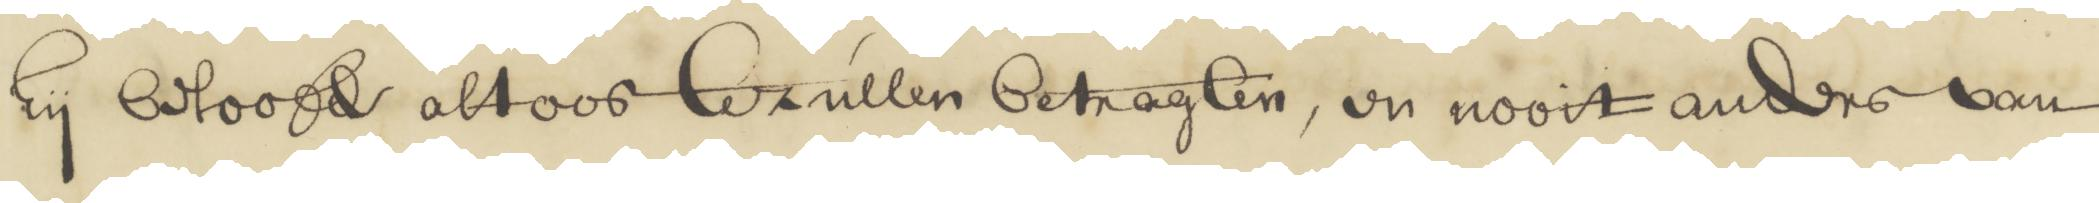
hij beloofde altoos te zullen betragten, en nooit anders van
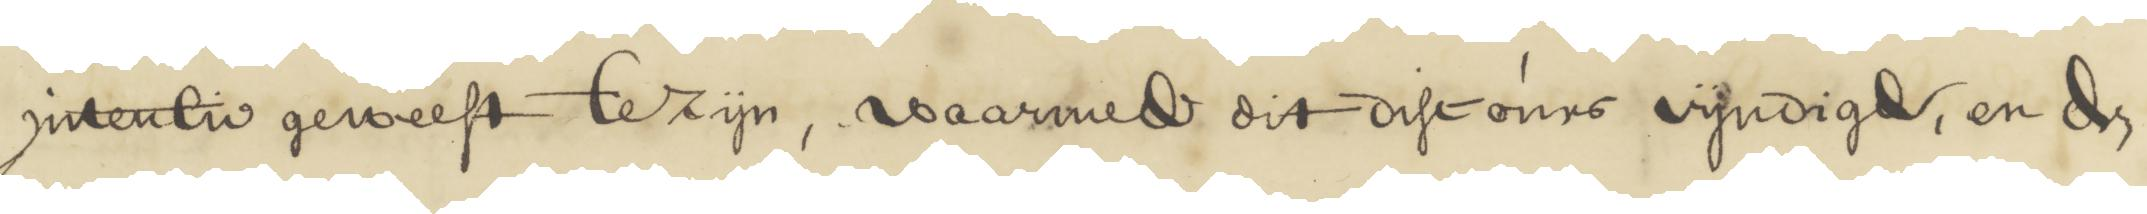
jntentie geweest te zijn, waarmede dit discours eijndigde, en den
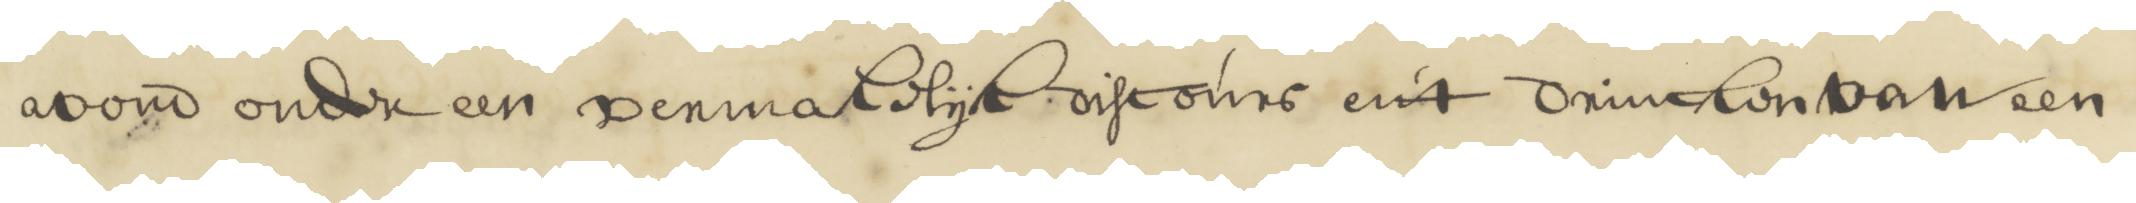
avond onder een vermakelijk discours en’t drincken van een
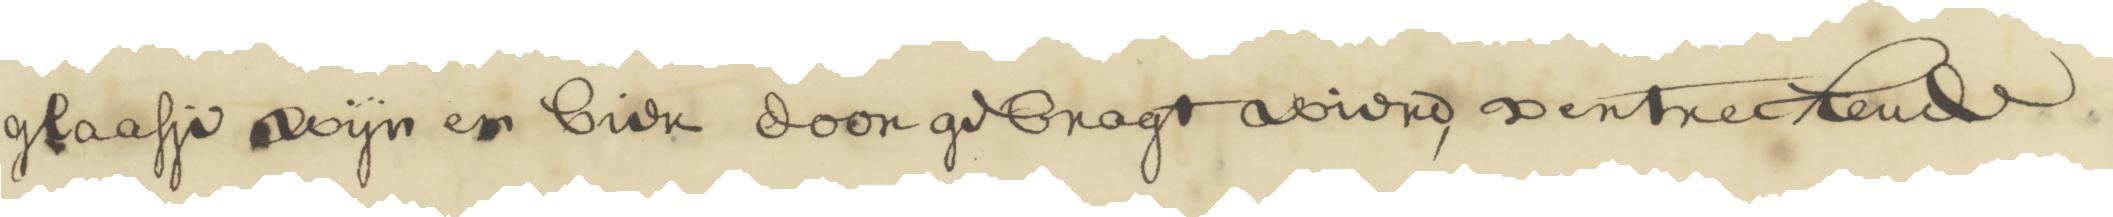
glaasje wijn en bier door gebragt wierd, vertreckende
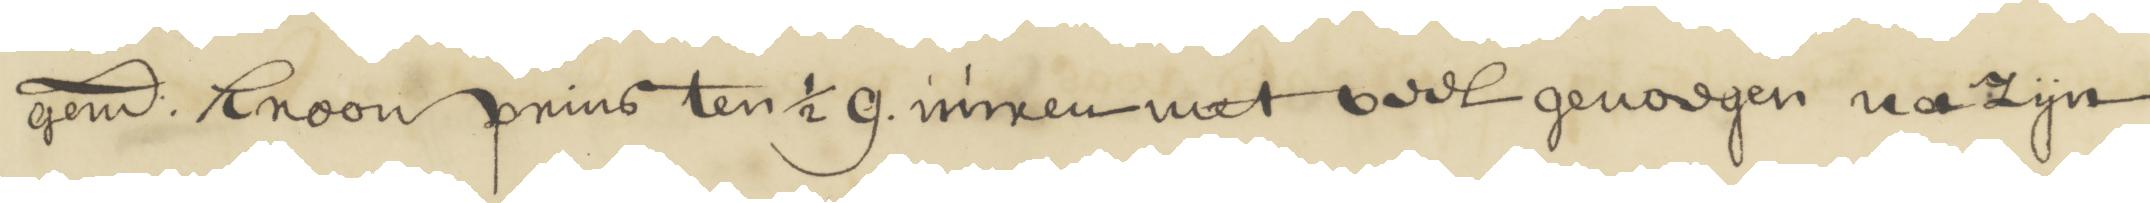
gem: kroon prins ten ½9. uuren met veel genoegen na zijn
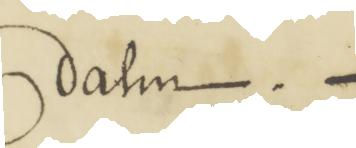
dalm.
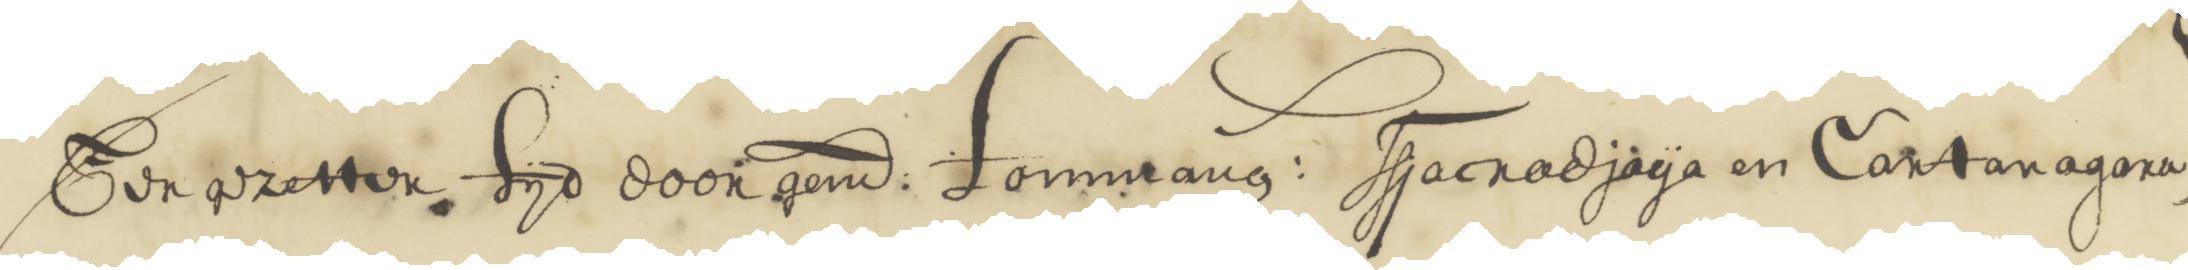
Per gezetter tijd door gem: tommang: Tsjacradjaija en Cartanagora
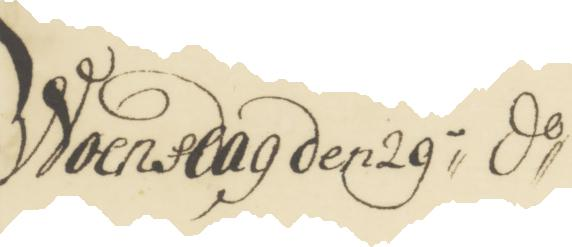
Woensdag den 29„' d„o
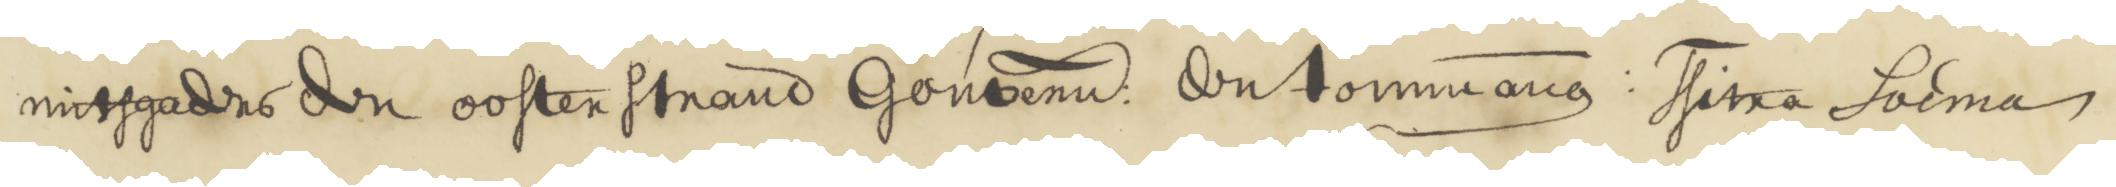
mitsgaders den ooster strand gouvern: den tommang: Tsitra soema
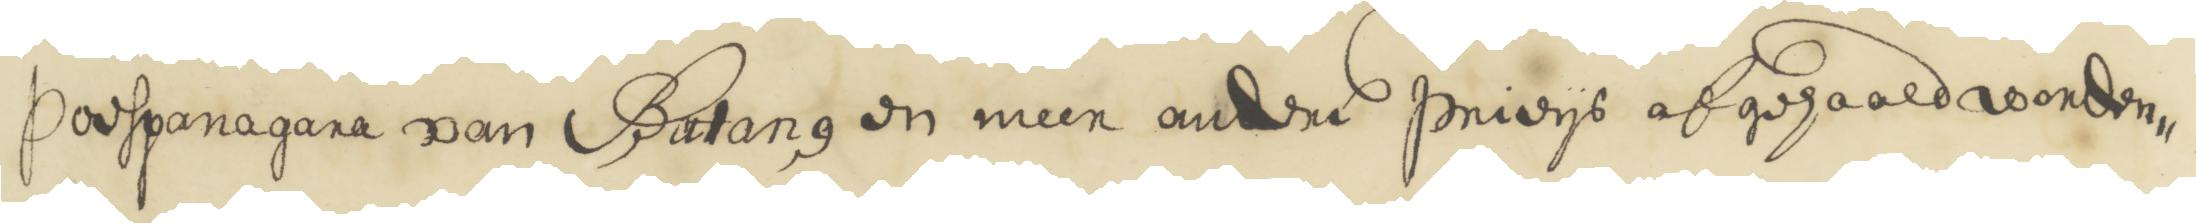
poespanagara van Batang en meer andere prieijs afgehaald worden„
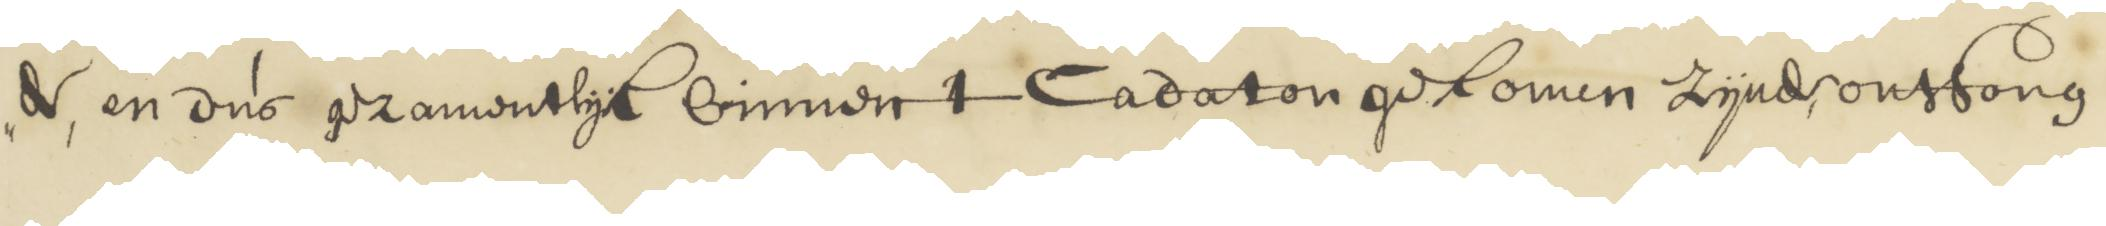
de, en dus gezamentlijk binnen 't cadaton gekomen zijnde, ontfong
